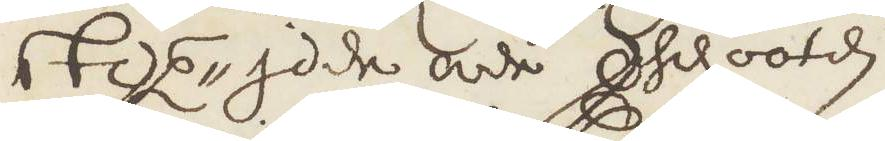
stvers„ jder dier verschooten
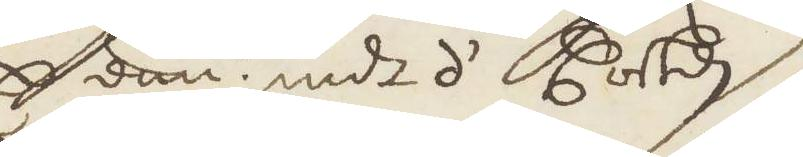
penn: met d' Costen,
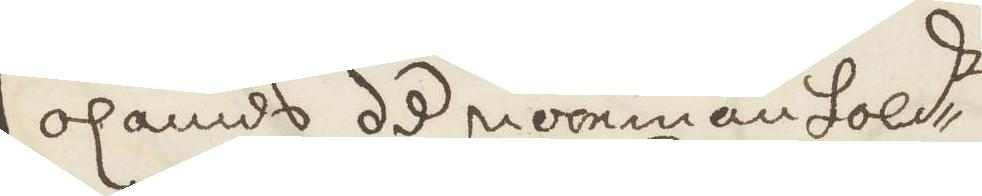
Johannes de noorman sold„t
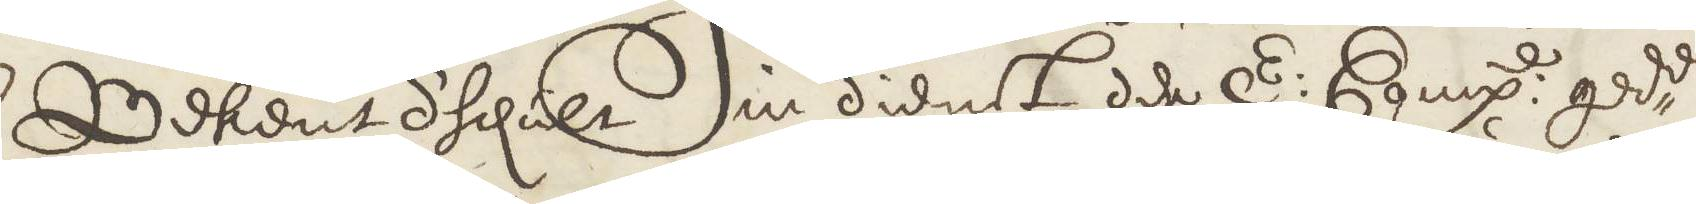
de ged„e Bekent d' schult in dienst der E: Comp:e ged„e
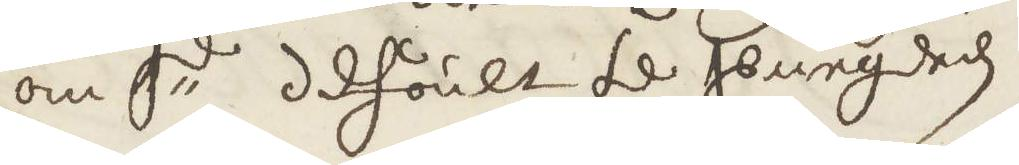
om j„e defoult te purgeren
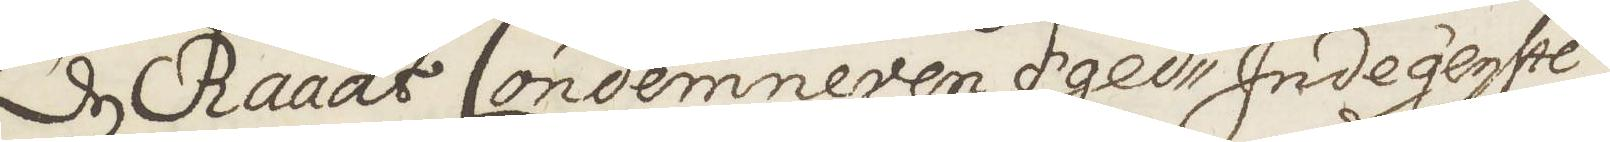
Den Raadt Condemneren d' ged„e Jnde g'eyste
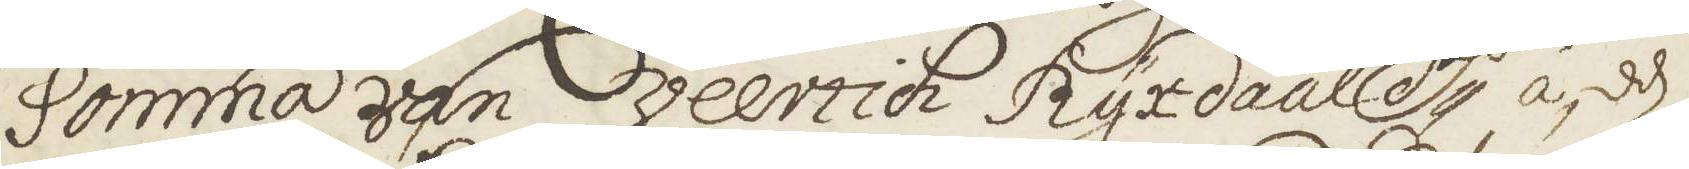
somma van veertich Rijxdaald„rs á, een
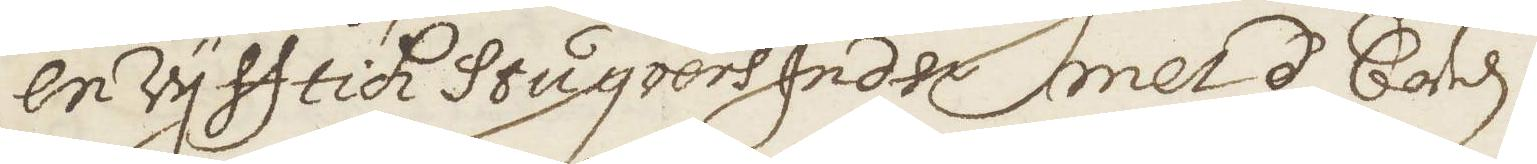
en vijfftich stuyvers Jnder met d’ Costen
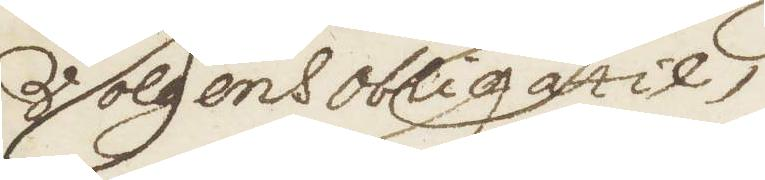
volgens obligatie,
